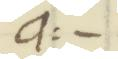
4: –
